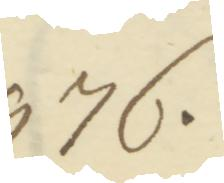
976.
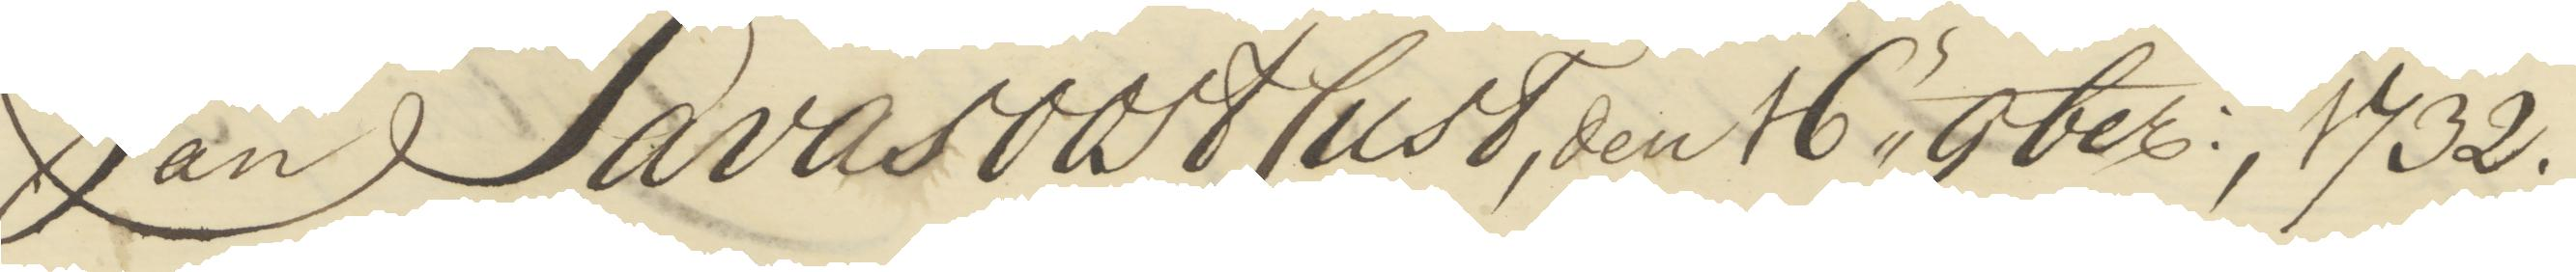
Van IavasoostCust, den 16„' 9ber:, 1732.
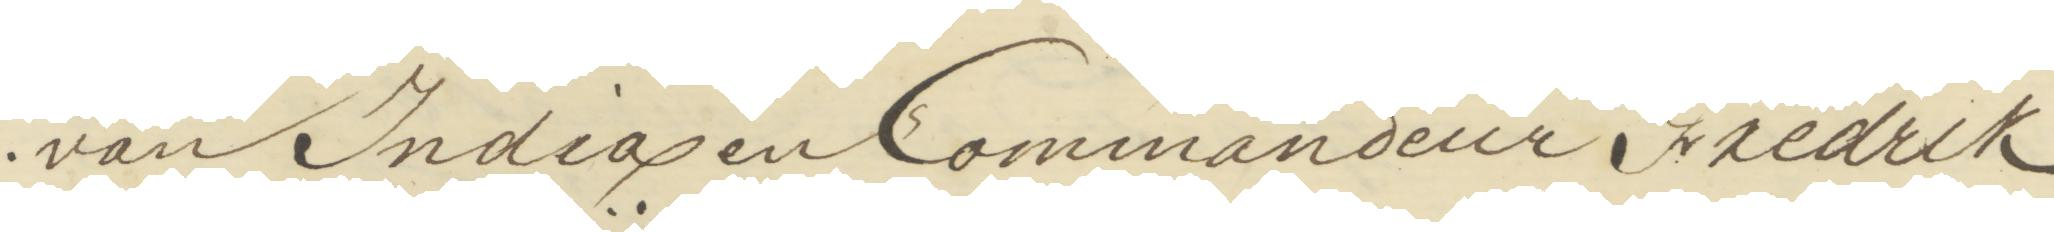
van India en Commandeur Fredrik
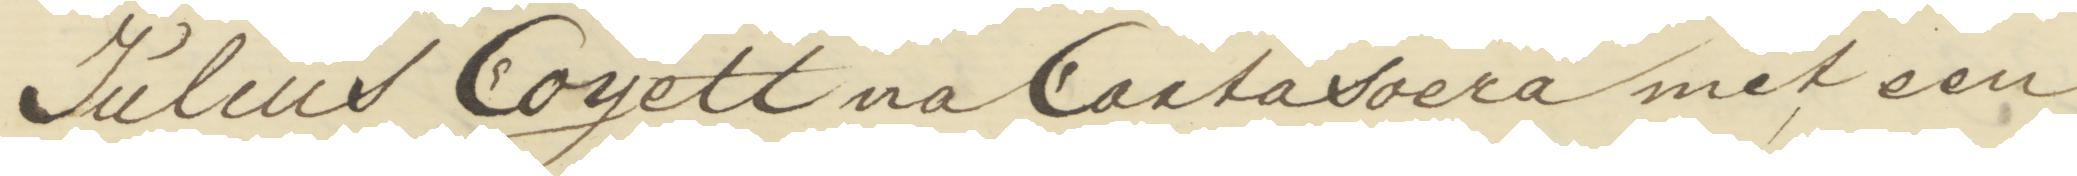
Iulius Coijett na Cartasoera met een
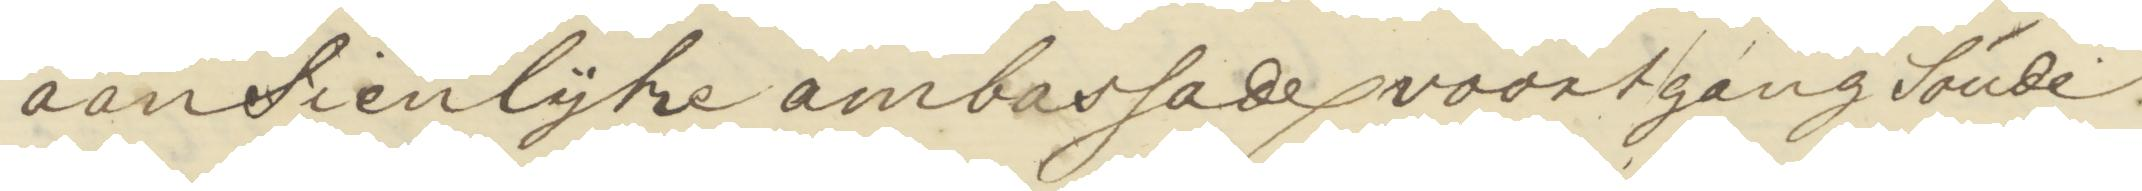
aansienlijke ambassade voortgang soude
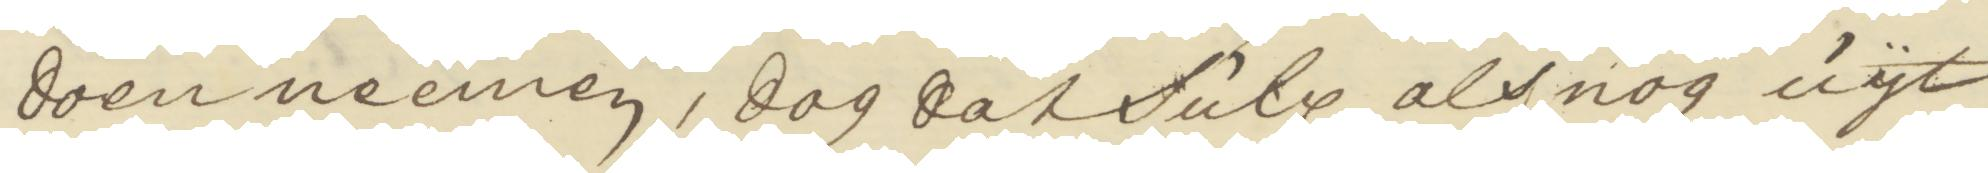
doen neemen, dog dat sulx als nog uijt
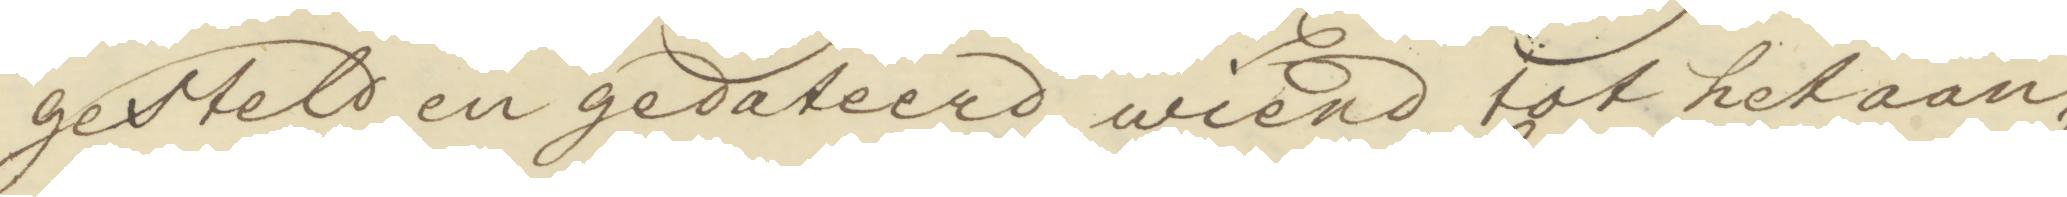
gesteld en gedateerd wierd tot het aan
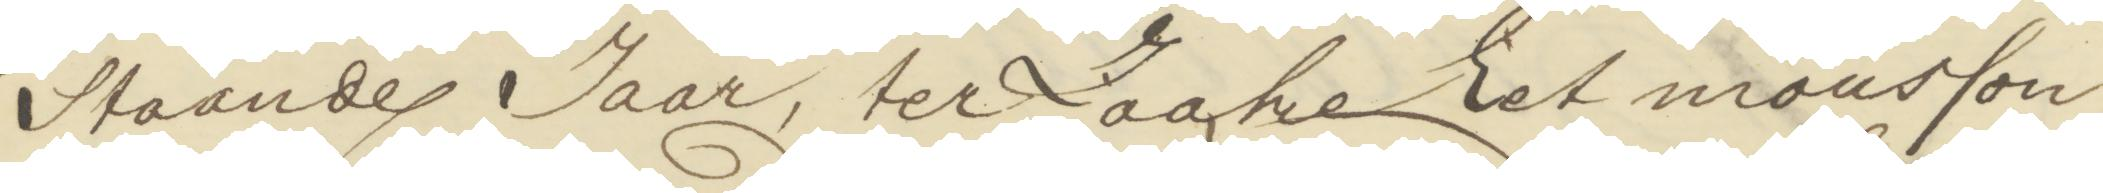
staande Iaar, ter Zaake het mousson
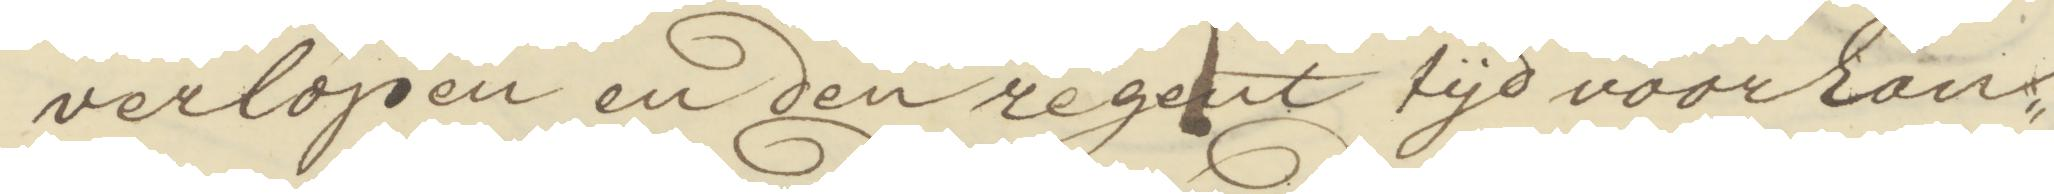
verlopen en den regent tijd voorhan„
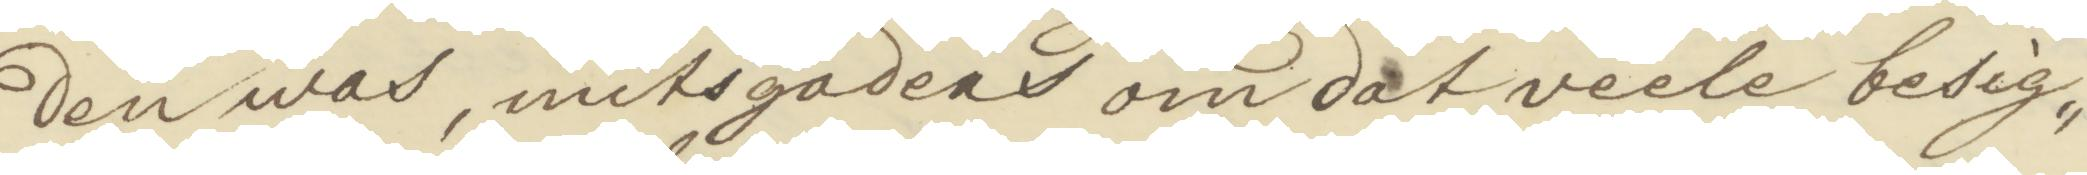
den was, mitsgaders om dat veele besig„
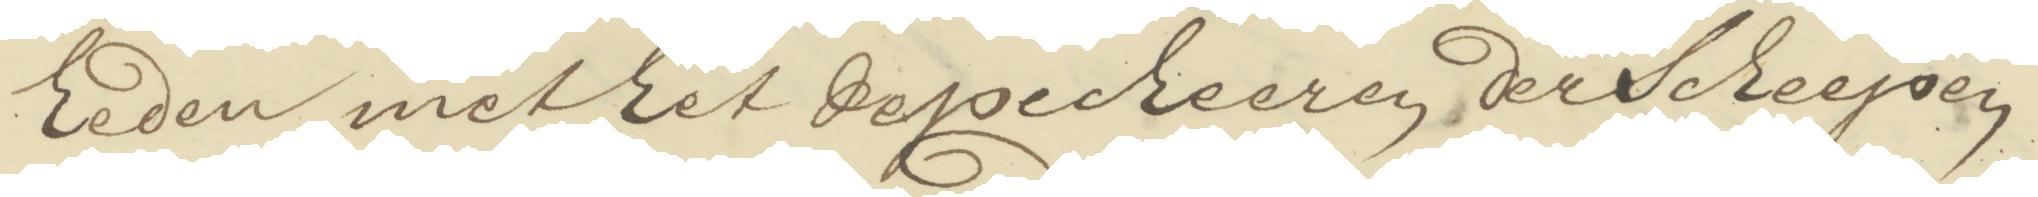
heden met het depecheeren der scheepen
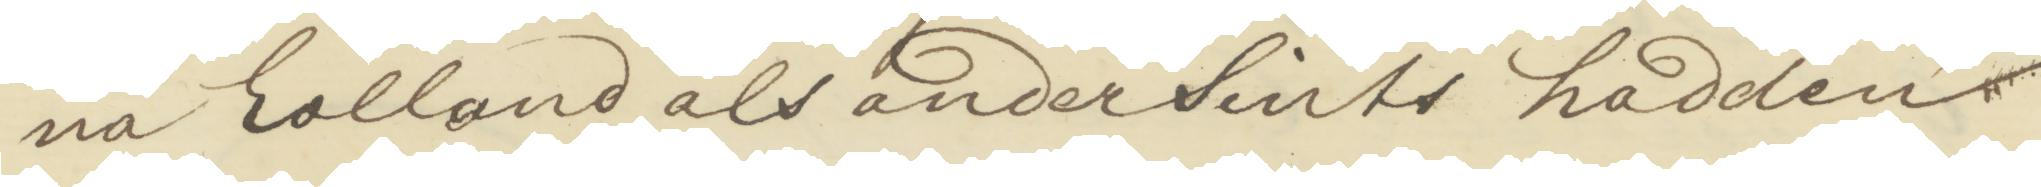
na holland als andersints hadden
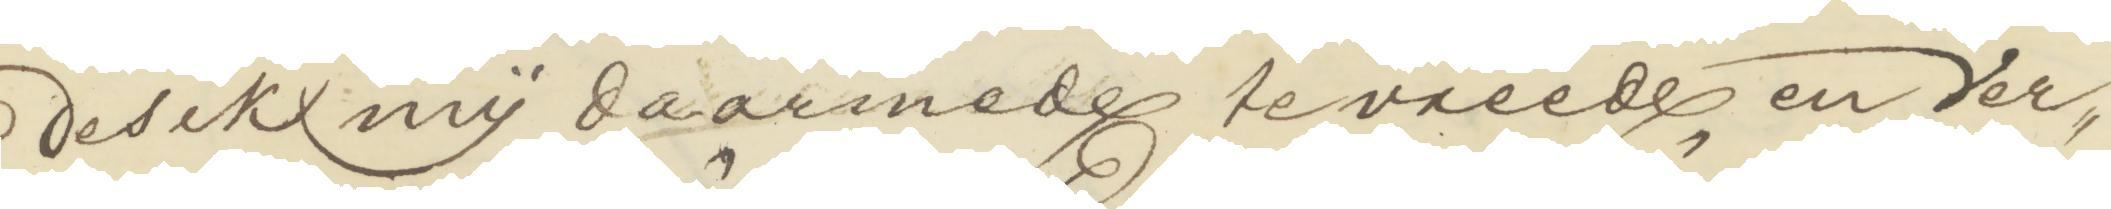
des ik mij daarmede te vreede en Ver„
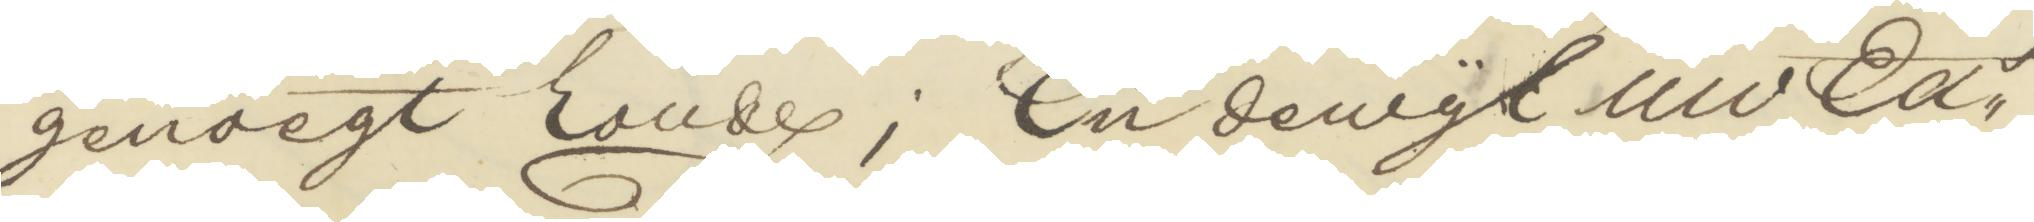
genoegt houde; En dewijl uw Ed„s
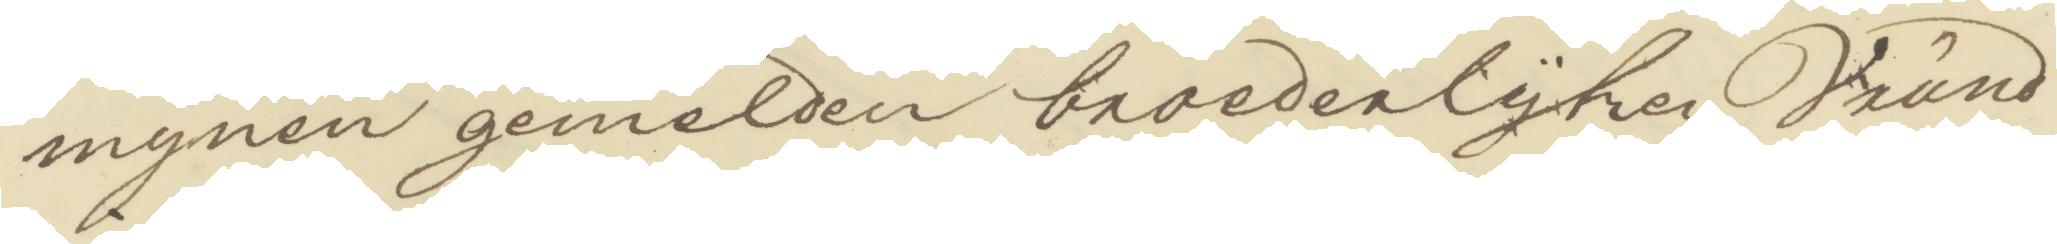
mijnen gemelden broederlijken Vrund
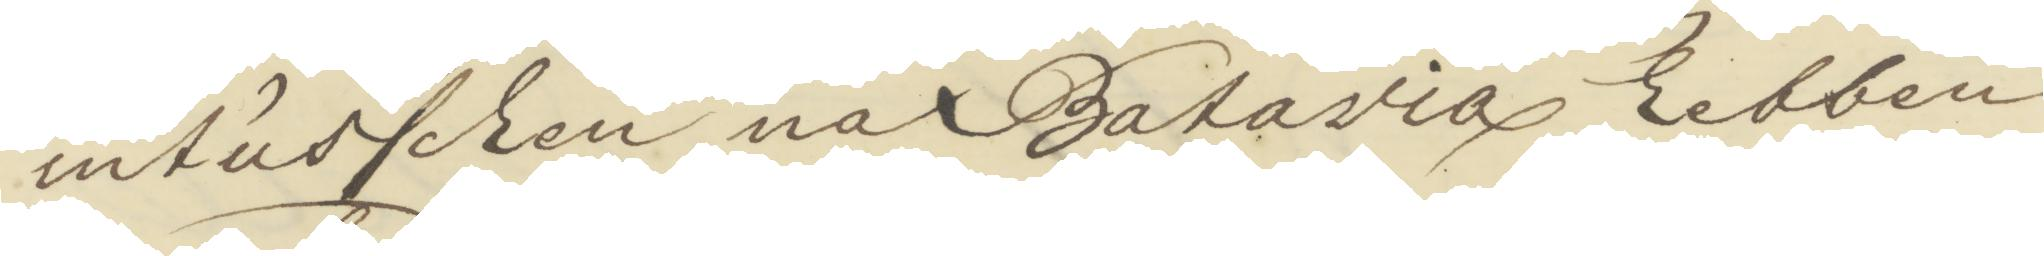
intusschen na Batavia hebben
